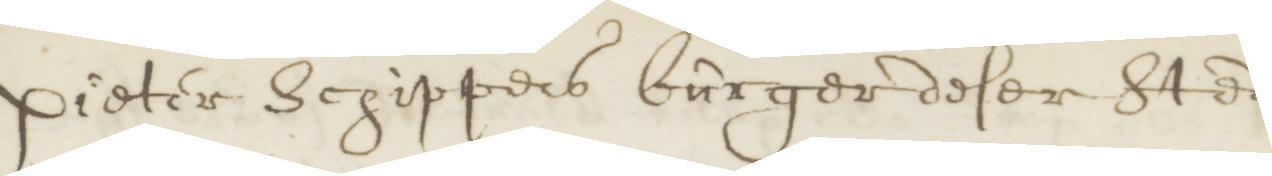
Pieter schippers burger deser stede.
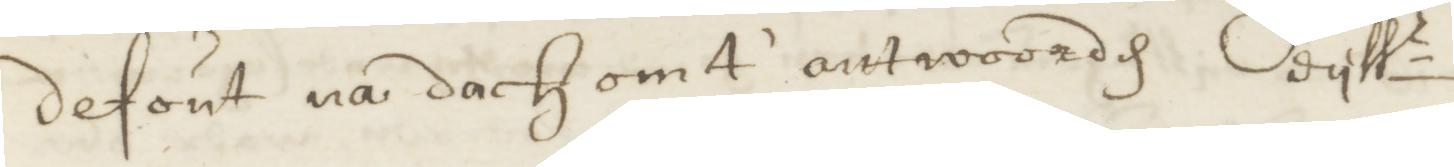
defout na dach om t' antwoorden eijss=r
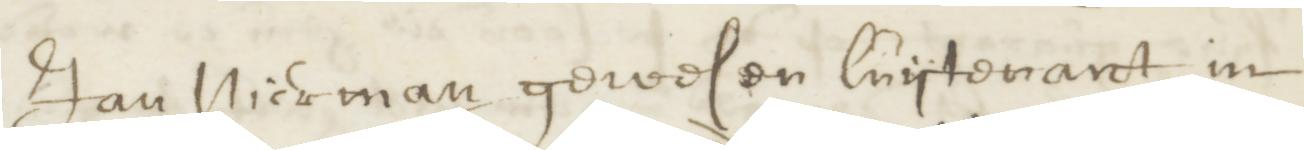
Jan Nierman gewesen luijtenant in
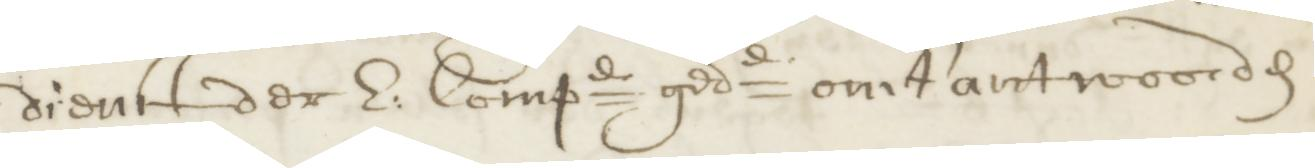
dienst der E: Comp=e ged=e om t'antwoorden
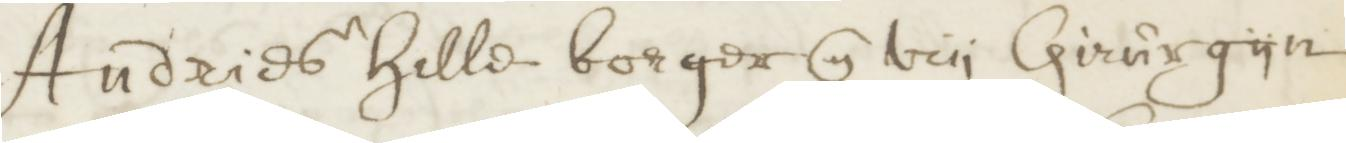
Andries hille borger ende vrij Chirurgijn
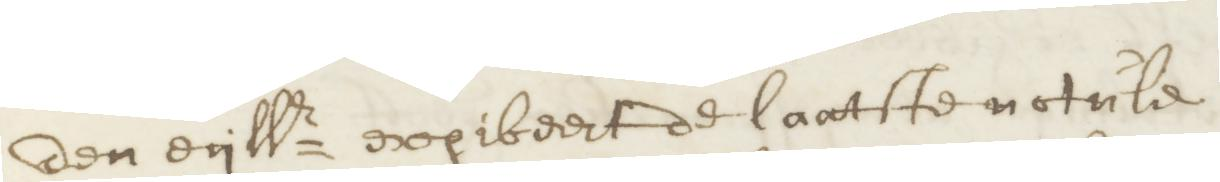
den eijss=r exhibeert de laatste notule
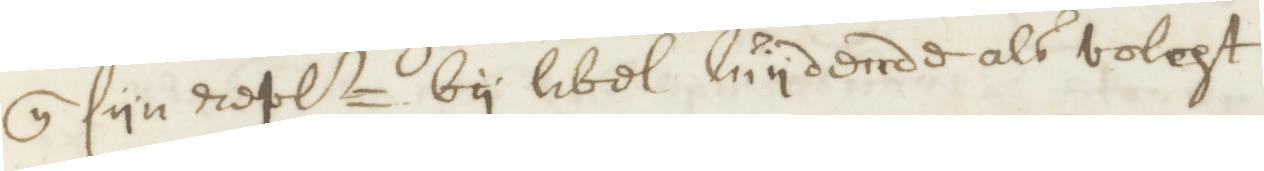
ende sijn repl= bij libel luijdende als volgt
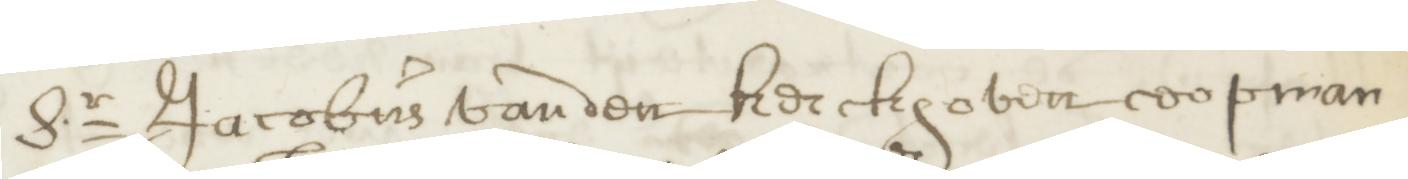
H=r Jacobus van den kerckhoven coopman
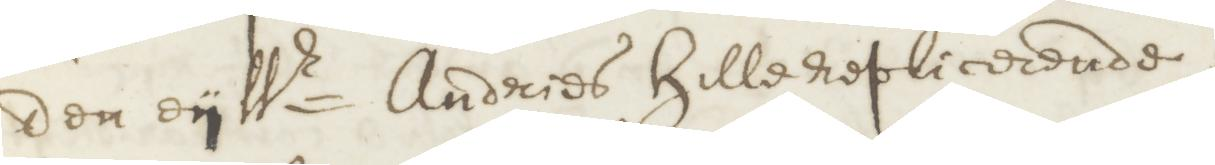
den eijss=r Andries hille replicerende
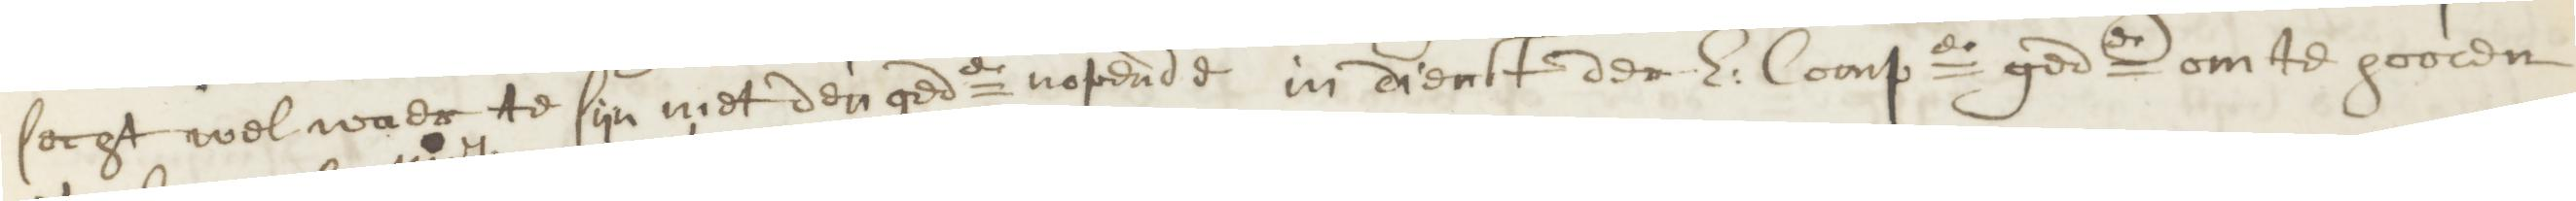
secht wel waer te sijn met den ged=e nopende in dienst der E: Comp=e ged=e om te hooren
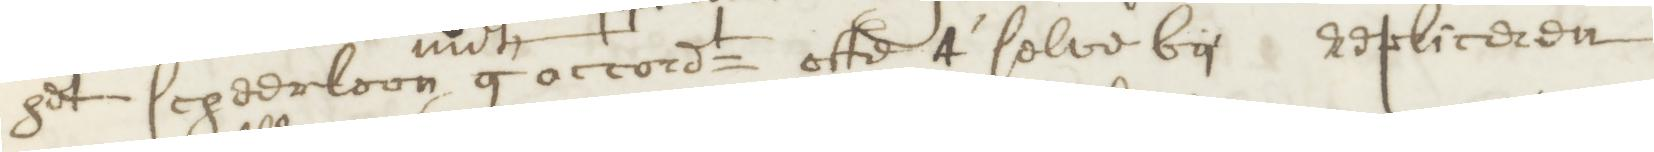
het scheerloon g’accord=t ofte t' selve bij repliceren
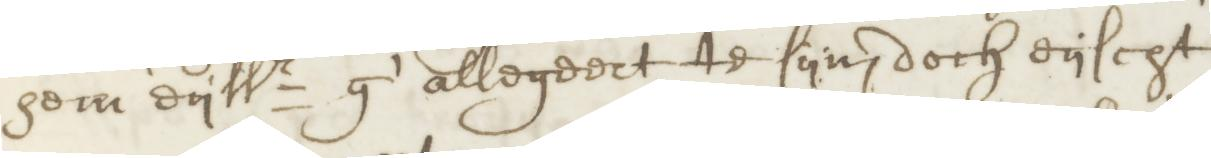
hem eijss=r g’allegeert te sijn, doch eijscht
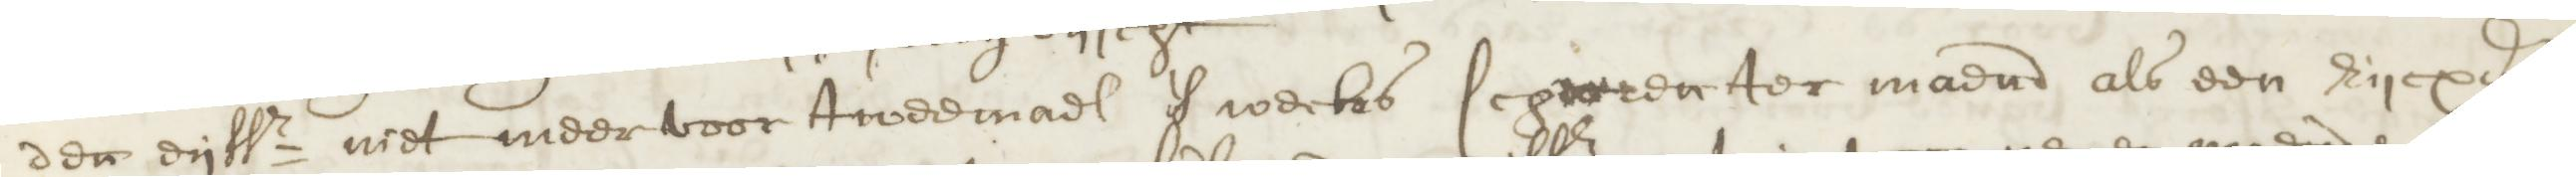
den eijss=r niet meer voor tweemael 's werks schren ter maend als een rijcxd=r
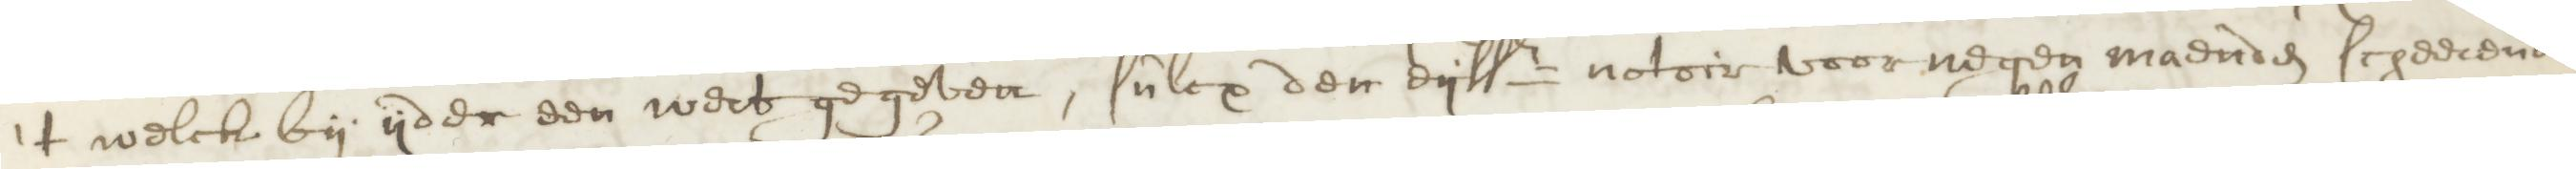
’t welck bij ijder een wert gegeven, sulcx den Eijss=r notoir voor negen maenden scheerens
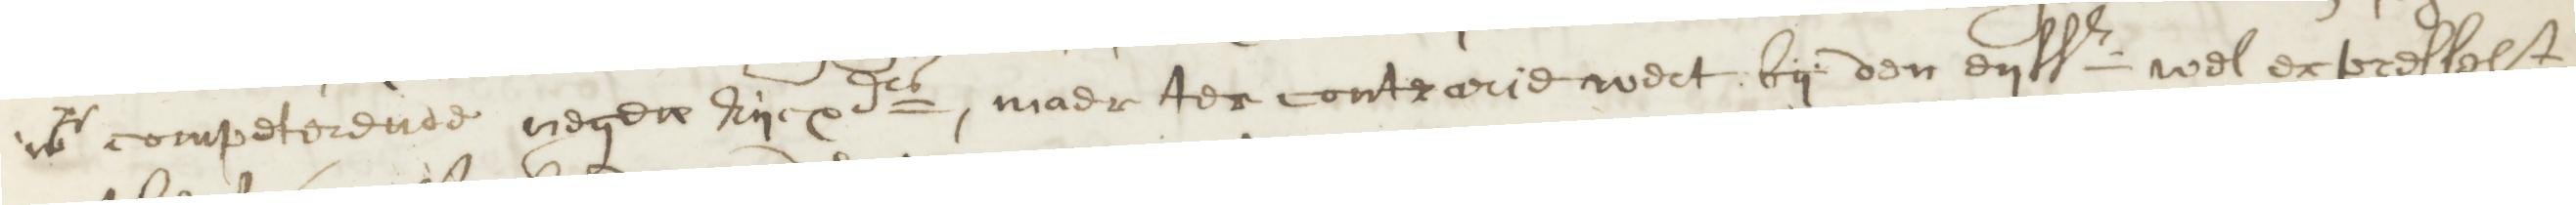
is competerende negen rijcxd=rs, maer ter contrarie wert: bij den eijss=r wel expresselijk
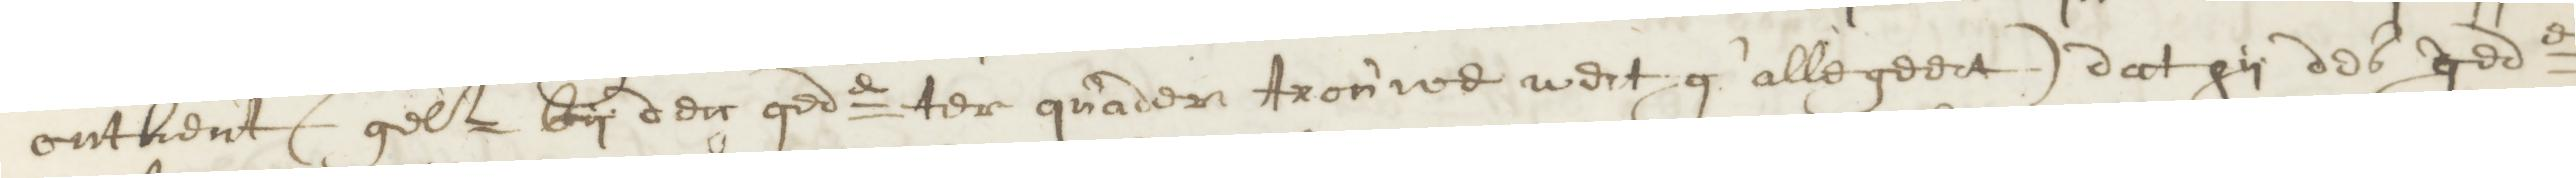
ontkent gelijk bij der ged=e ter quaden trouwe wert: g:' allegeert -) dat hij des ged=es
